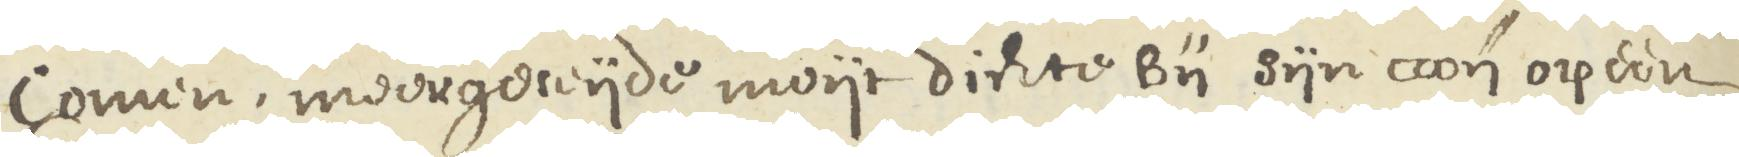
Comen, meergeseijde meijt dichte Bij sijn wij op een
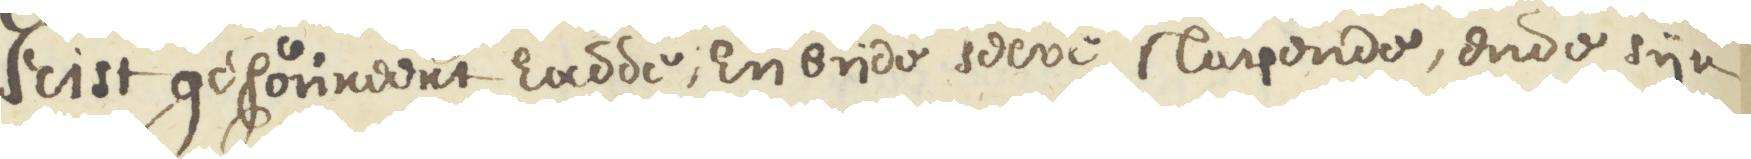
kist gegoureert hadde, hij bijde selve slapende, ende sijn
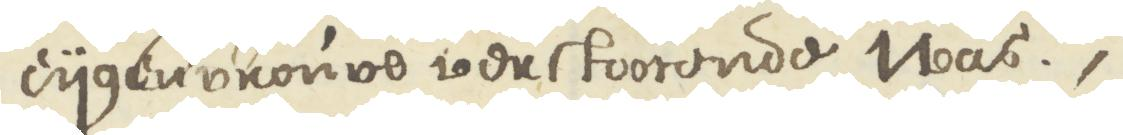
eijgen vrouw verstorende was.,
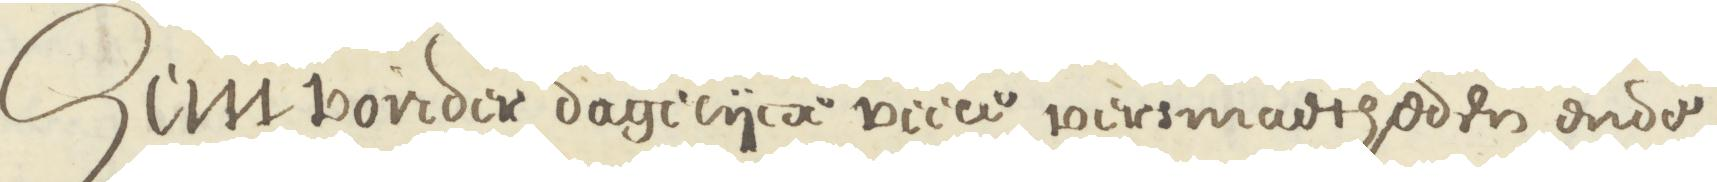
Hem voirder dagelijcx veele versmaetheden ende
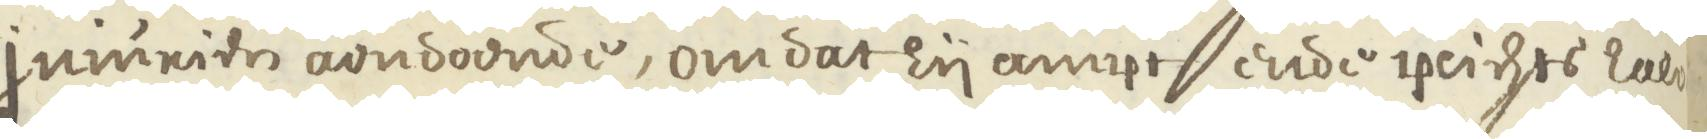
jniurien aen doende, om dat hij ampt ende plichts halv
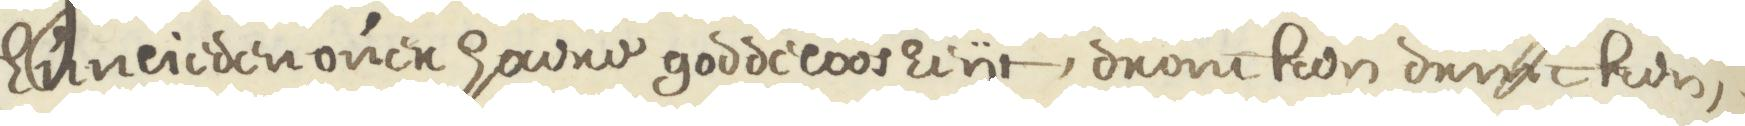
hunlieden ouer haere goddeloosheijt, droncken drincken,
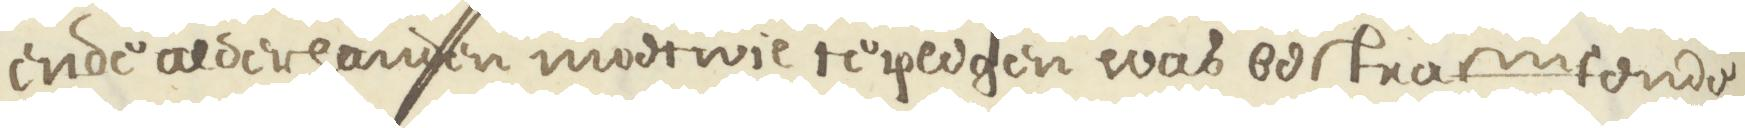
ende alderhanden moetwil te plegen was bestraffende
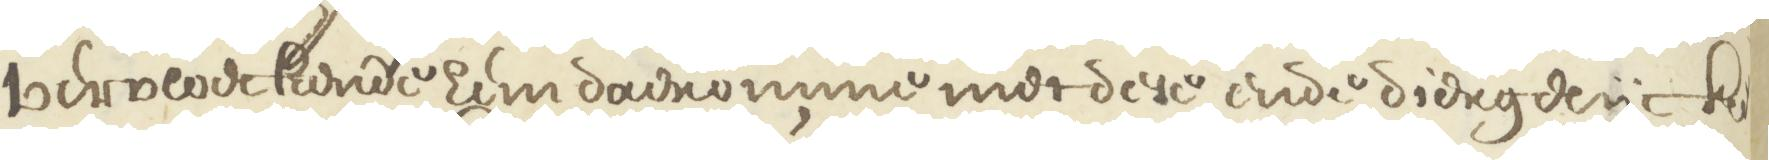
vervloeckende hem daeromme met dese ende diergelijck
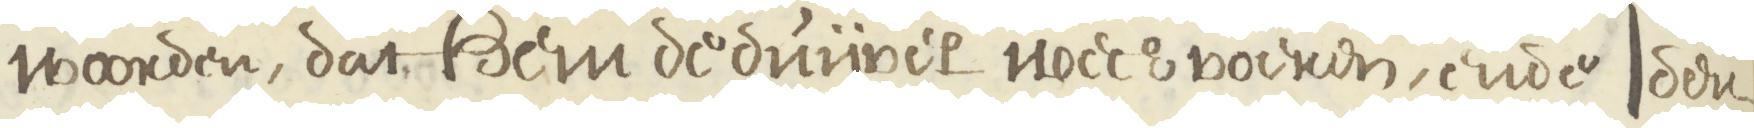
woorden, dat hem de duijvel wech voeren, ende den
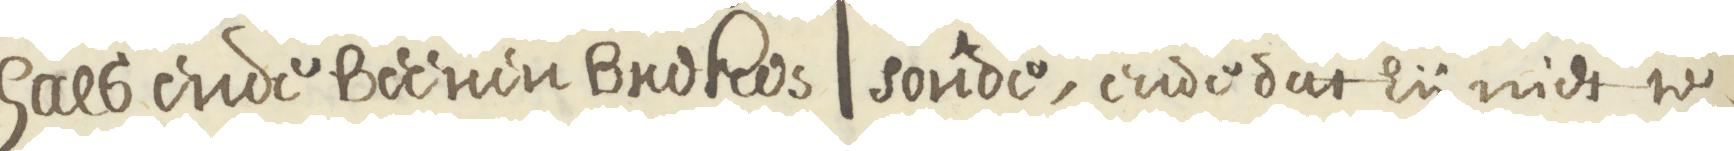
hals ende beenen brekes soude, ende dat hij niet te
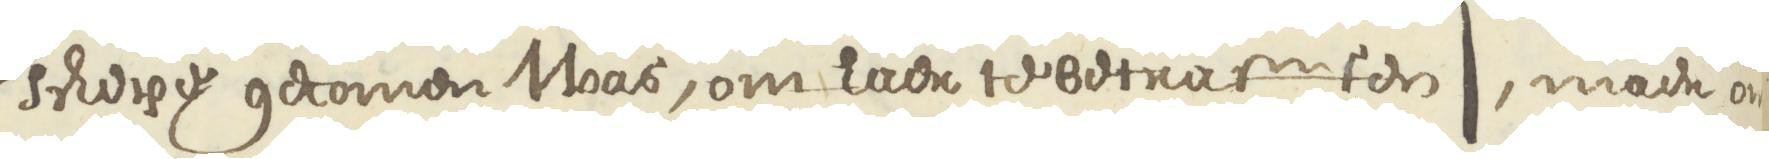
schepe gecomen was, om haer te betraffen, maer o
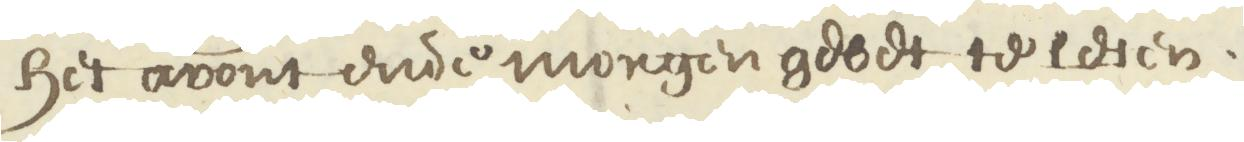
het avont ende morgen gebet te lesen.
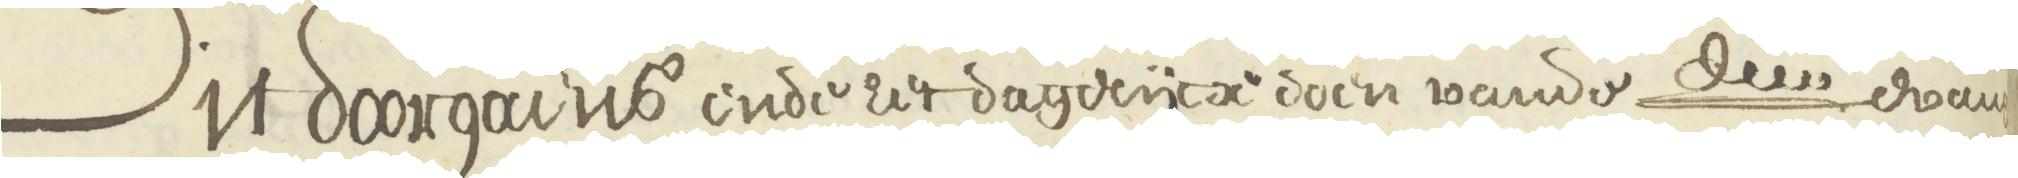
Dit doorgaens ende het dagelijcx doen vande Gevan
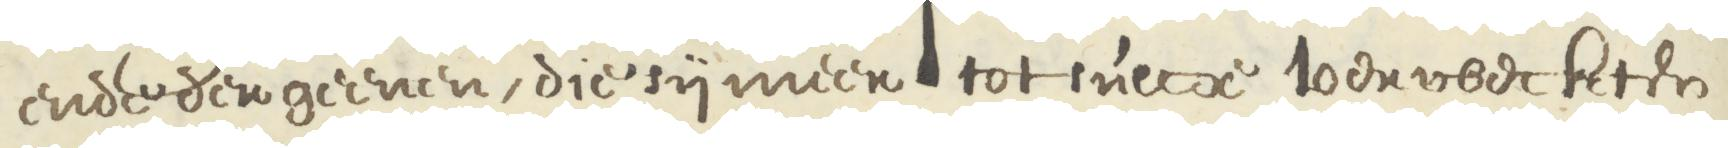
ende der geenen, die sij meer tot sulcx Verweckten
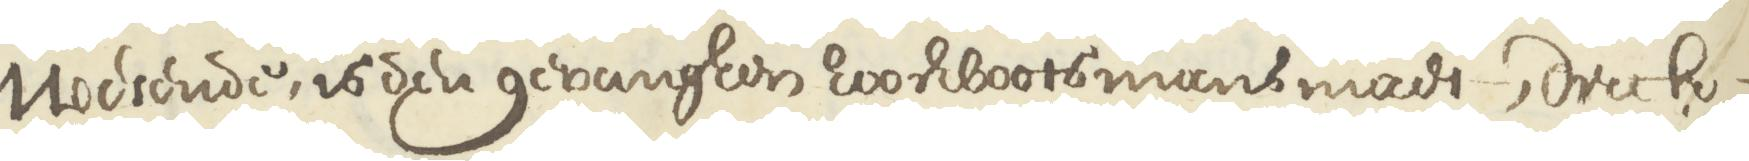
wesende, is den gevanghen hoochbootsmans maet, dirck
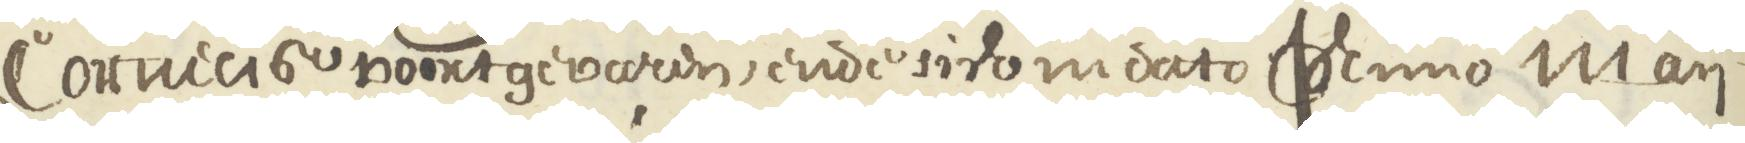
Cornelis voortgevaren, ende sich in dato Primo Maij
